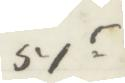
51=5
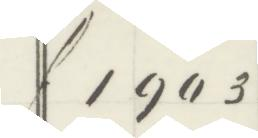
ƒ 1903
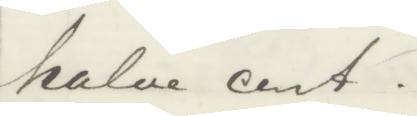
halve cent.
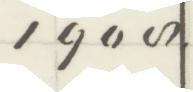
1908
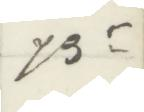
73-5
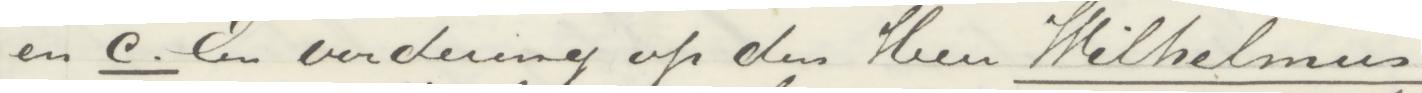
en c. Een vordering op den Heer Wilhelmus
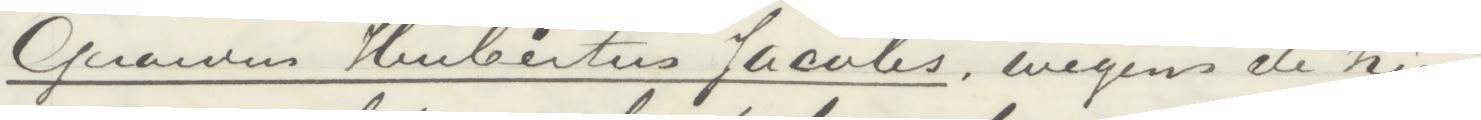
Gerardus Hubertus Jacobs, wegens de hier
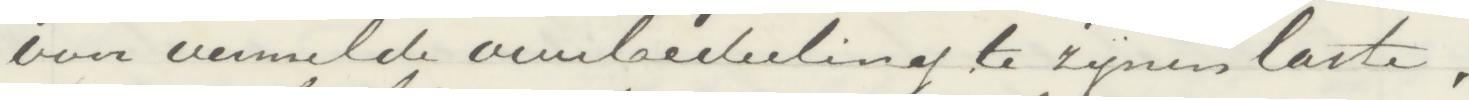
voor vermelde overbedeeling te zijnen laste,
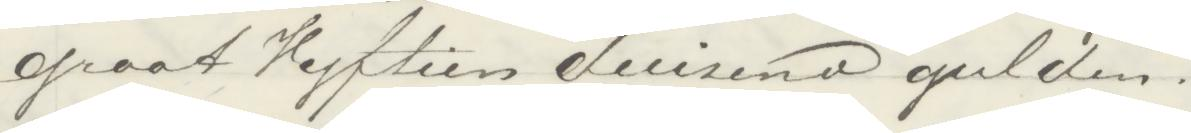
groot Vyftien duizend gulden.
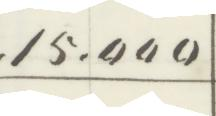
15.000
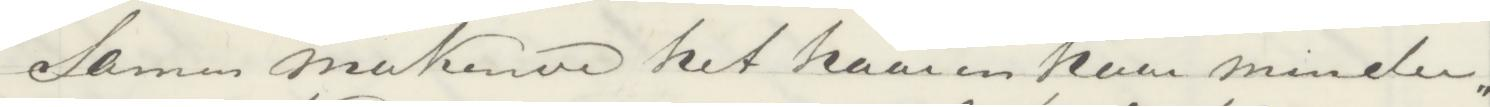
samen makende het haar en haar minder
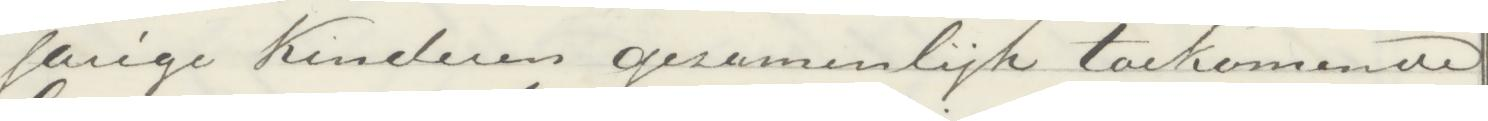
jarige kinderen gezamenlijk toekomende
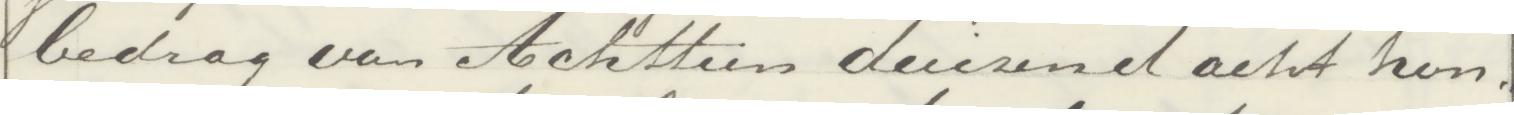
bedrag van Achttien duizend acht hon„
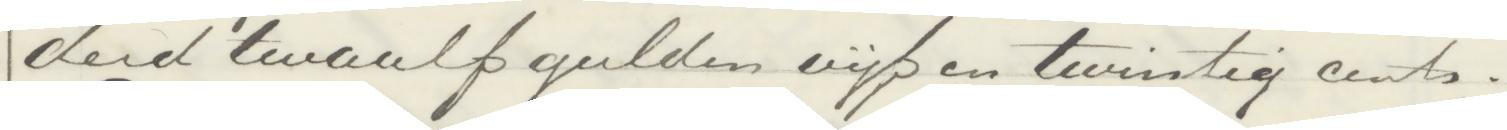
derd twaalf gulden vijf en twintig cents.
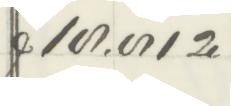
ƒ18.812
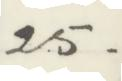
25 -
